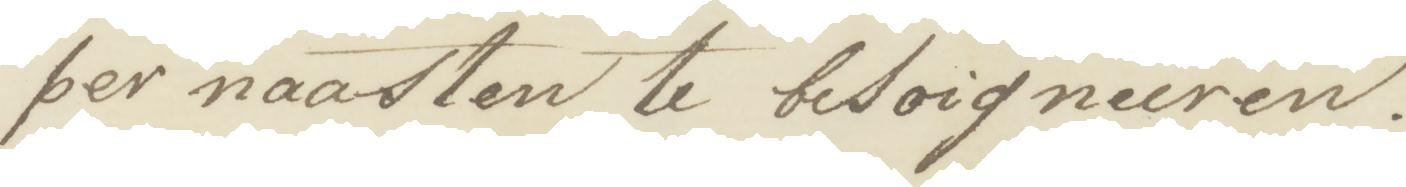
per naasten te besoigneeren.
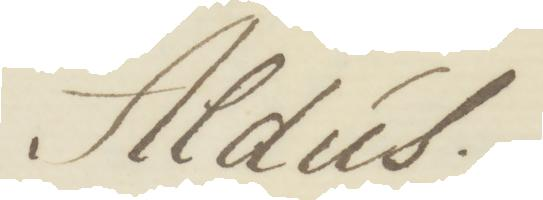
Aldus.
